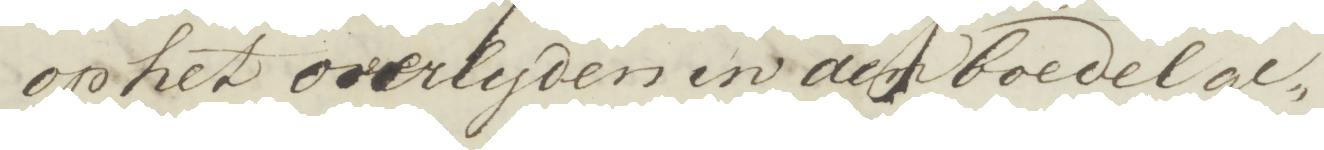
op het overlyden in den boedel ge„
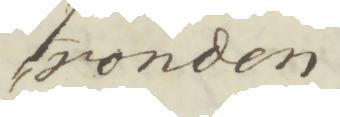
„vonden
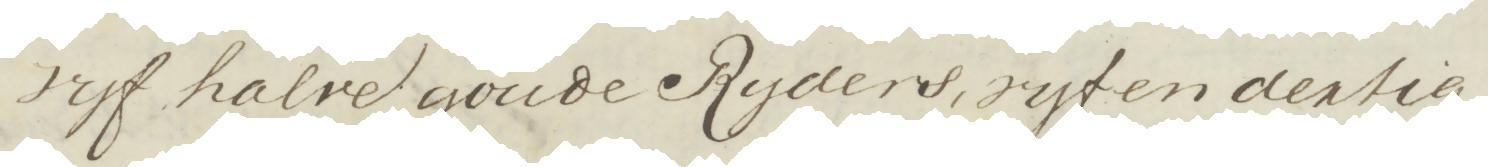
vyf halve goude Ryders, vyf en dertig
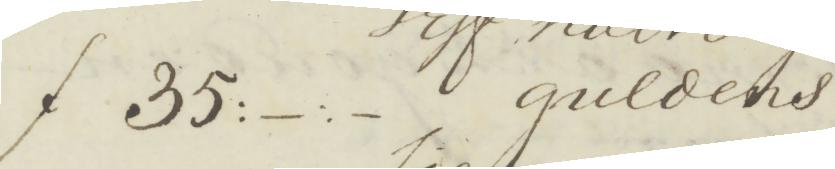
ƒ 35:— : – guldens
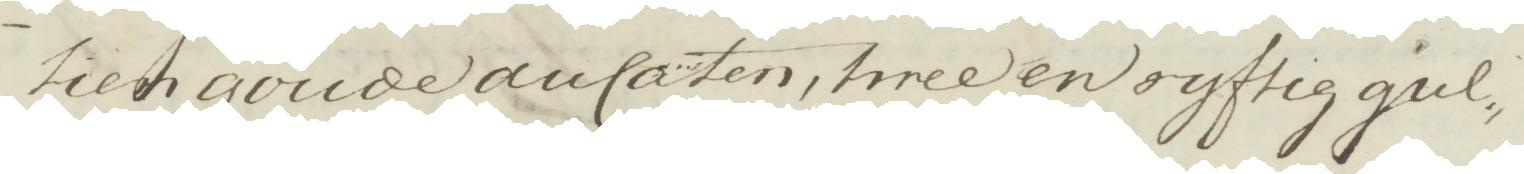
tien goude ducaten, twee en vyftig gul„
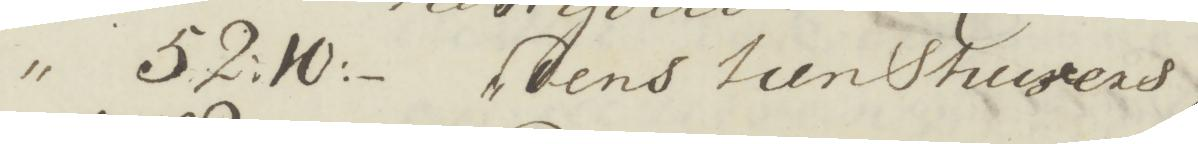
„ 52:10:– „dens tien stuivers
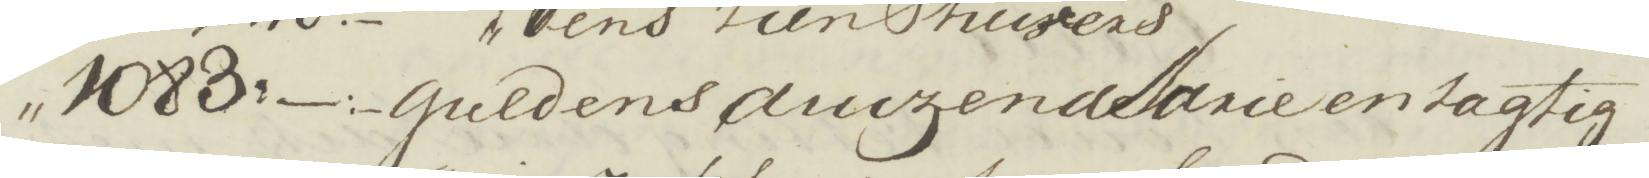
„1083:—:– guldens duizend drie en tagtig
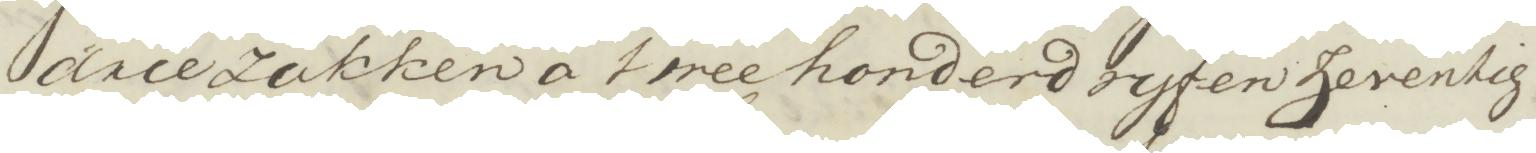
drie zakken a twee honderd vyf en zeventig
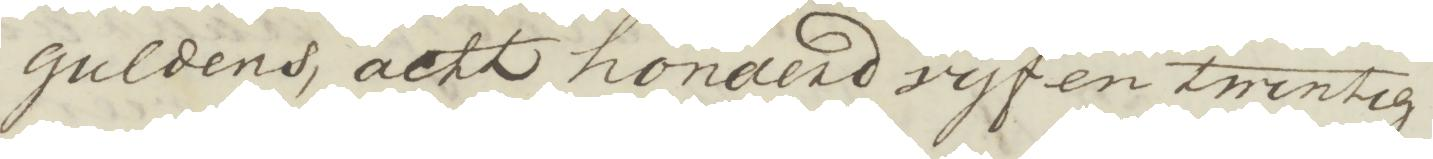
guldens, acht honderd vyf en twintig
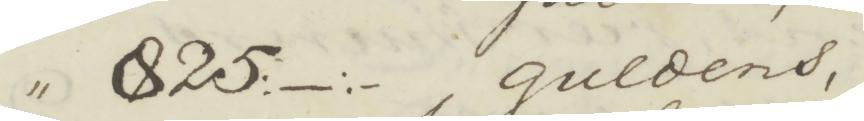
„ 825:—:– guldens,
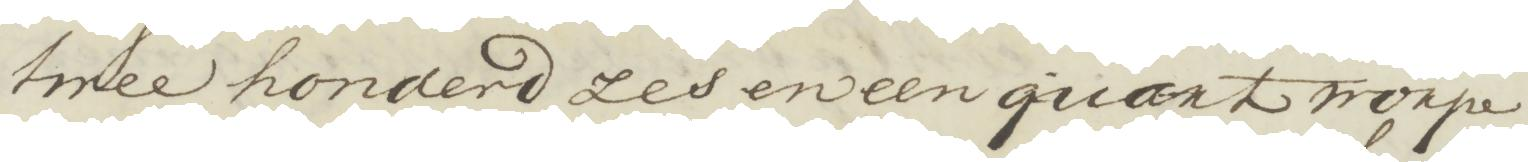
twee honderd zes en een quart worpe
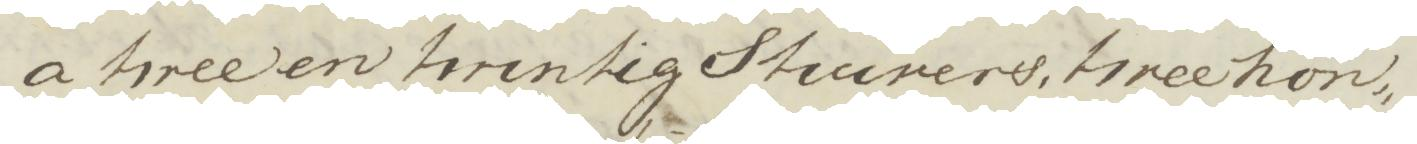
a twee en twintig Stuivers, twee hon„
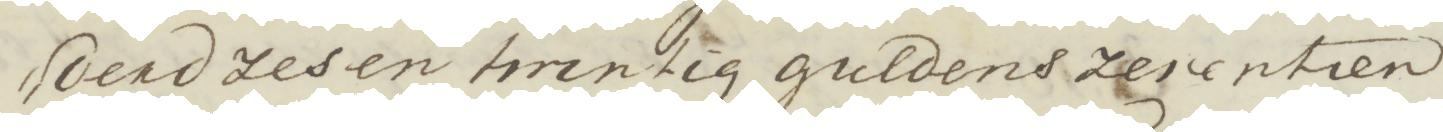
„derd zes en twintig guldens zeventien
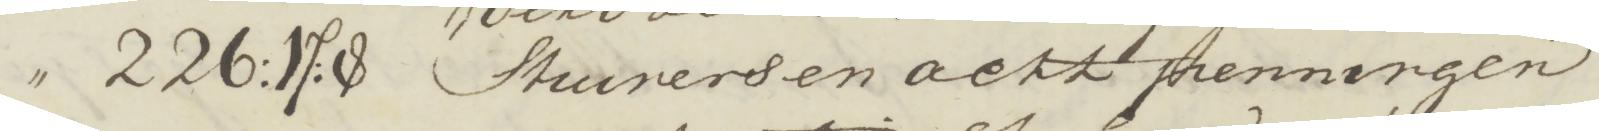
„ 226:17:8 Stuivers en acht penningen
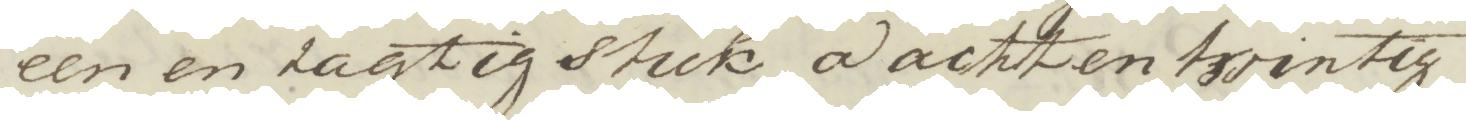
een en tagtig stuk a acht en twintig
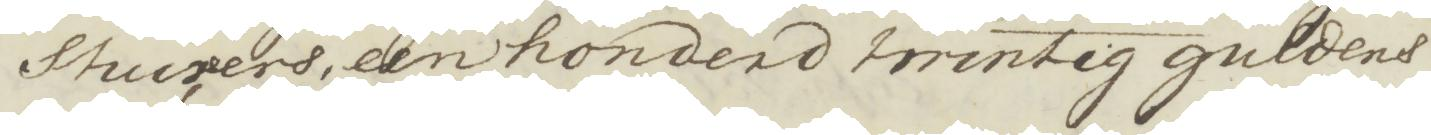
stuivers, een honderd twintig guldens
